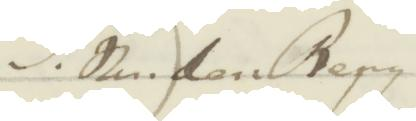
P. Van den Berg
